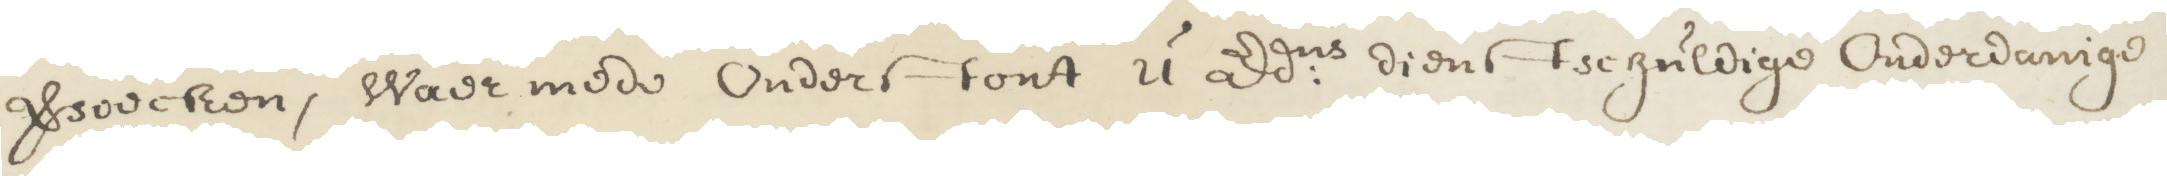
versoecken, waer mede onderstont u Ed:ns dienstschuldige Onderdanige
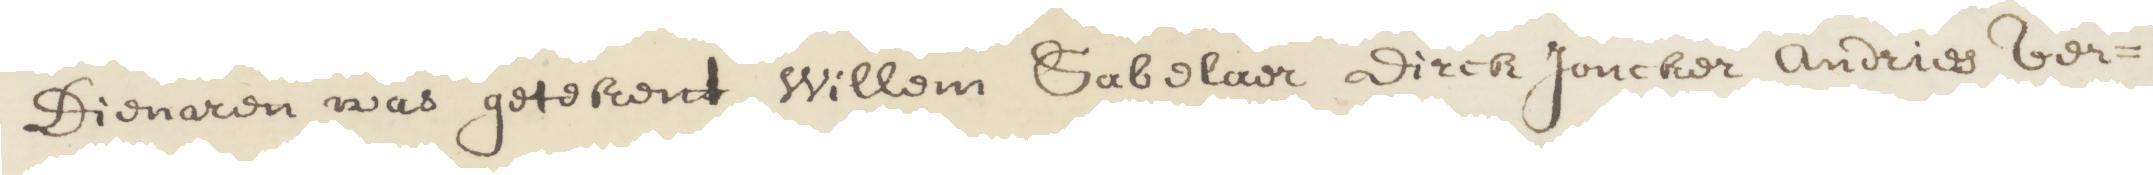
Dienaren was getekent Willem Sabelaer Dirck Joncker Andries Ver=
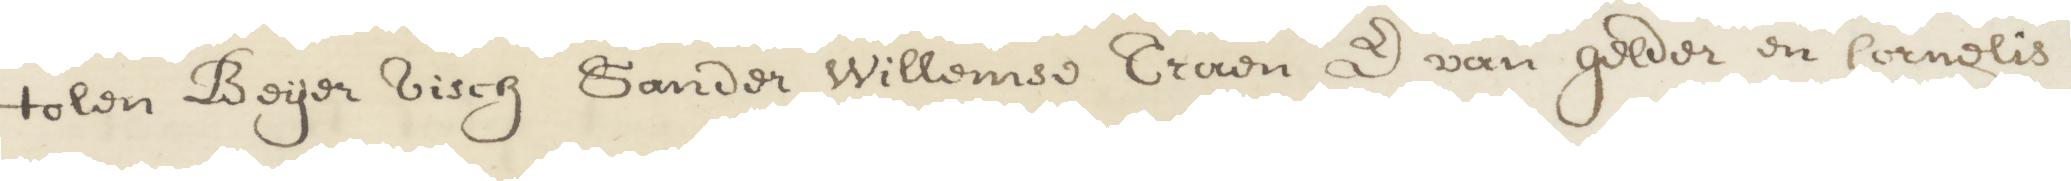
tolen Beijer Visch Sander Willemse Traen E van gelder en Cornelis
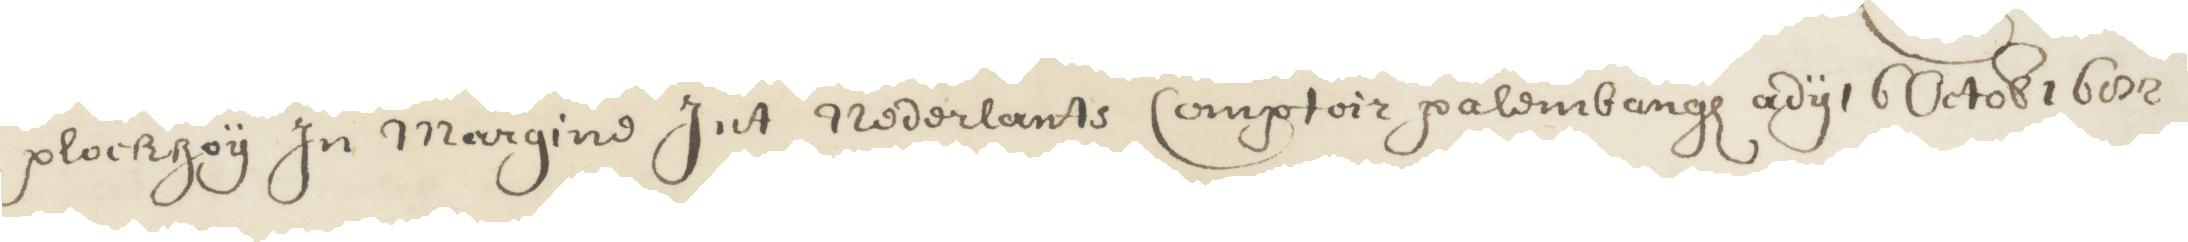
plockhoij Jn Margine Jnt Nederlants Comptoir palembangs adij 16 Octob 1682
